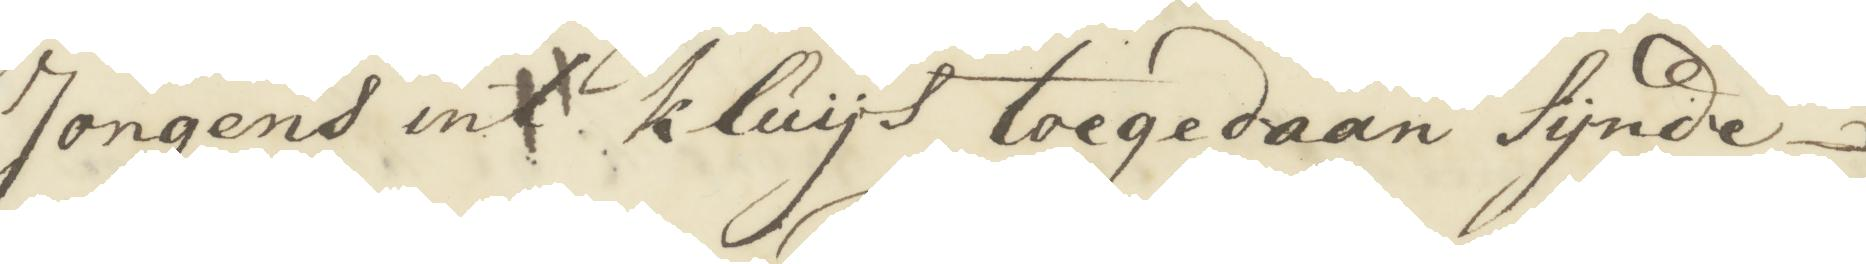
Jongens int kluijs toegedaan sijnde
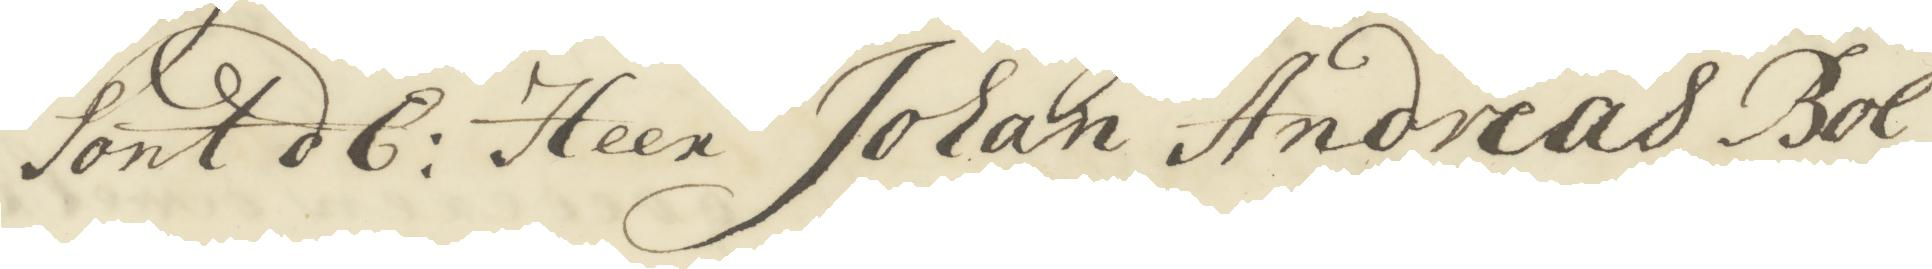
sont dE: Heer Johan Andreas Bol
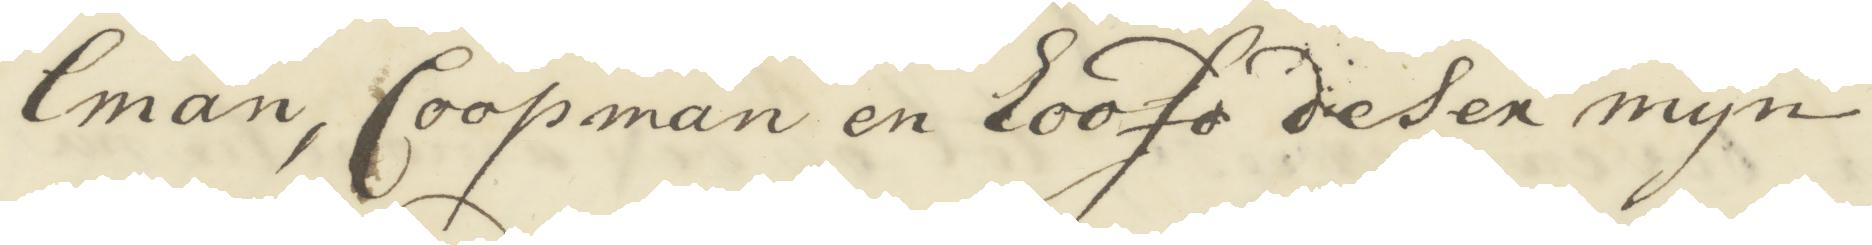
lman, Coopman en hoofd deser mijn
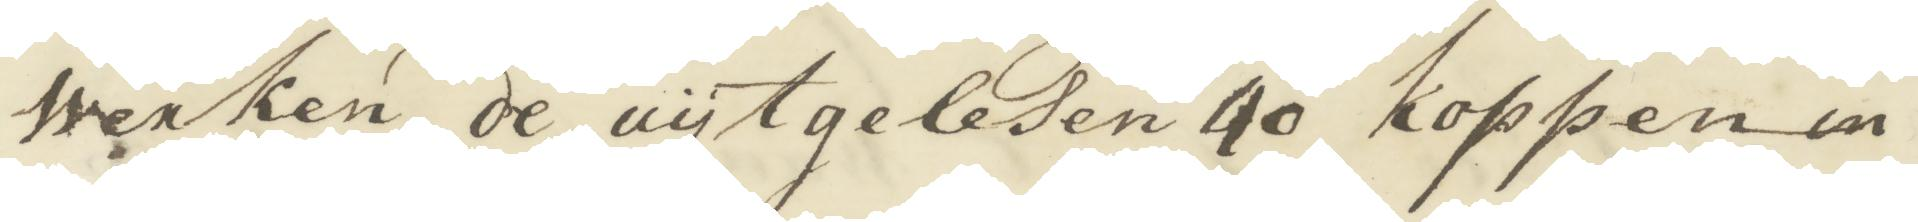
werken, de uijtgelesen 40 koppen in
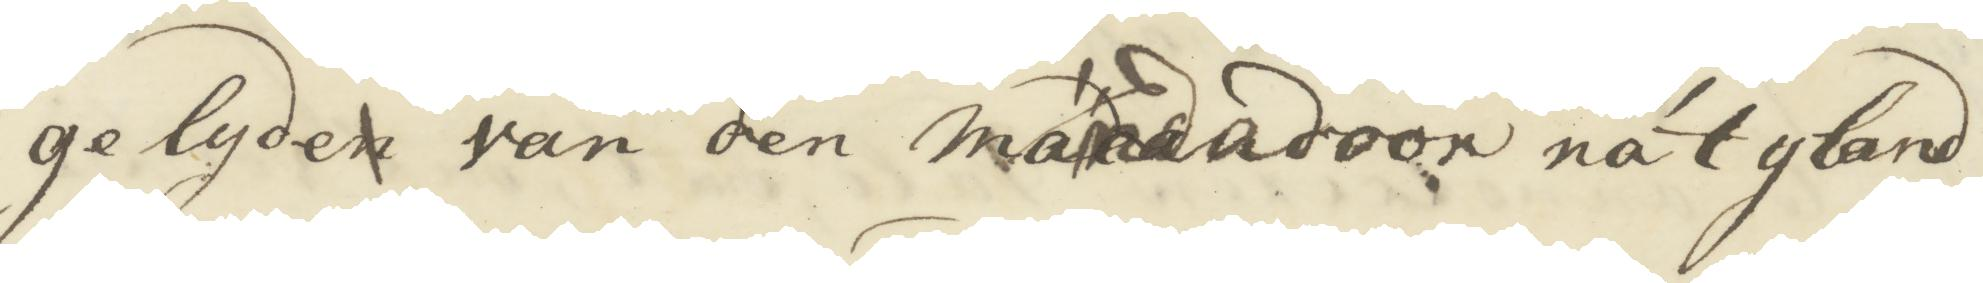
gelyden van den mandadoor na ’t yland
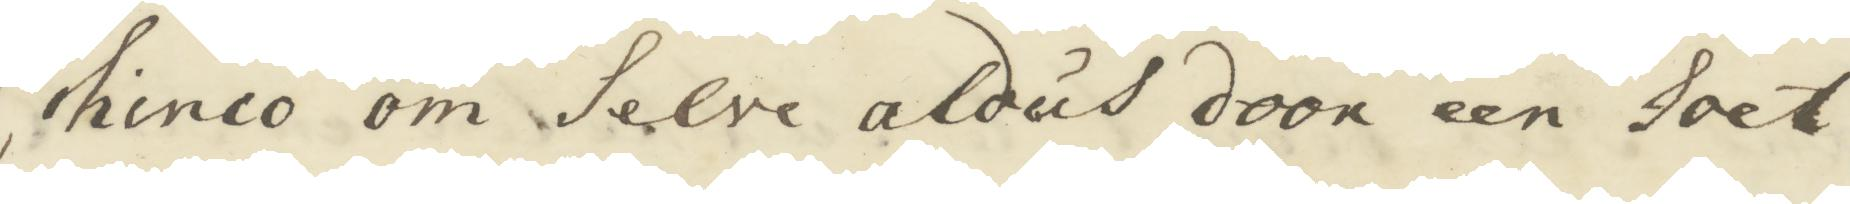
Chinco om selve aldus door een soet
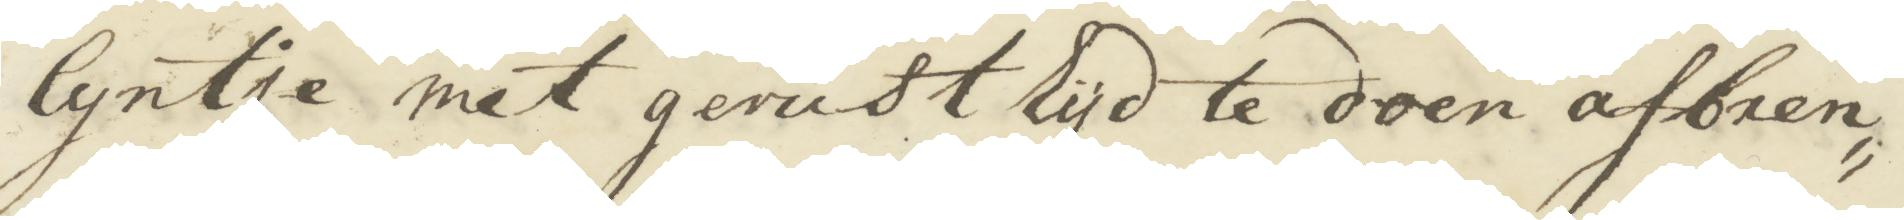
lyntje met gerusthijd te doen afbren„
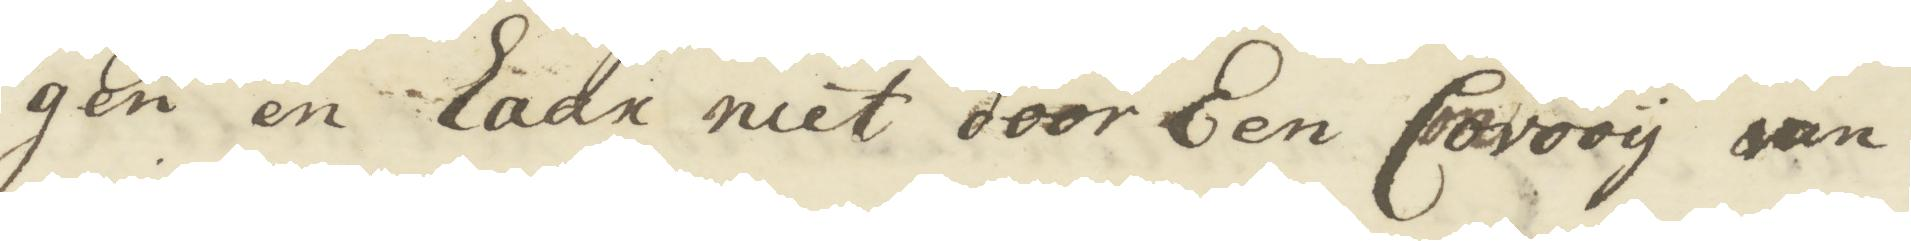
gen en haar niet door Een Convooij van
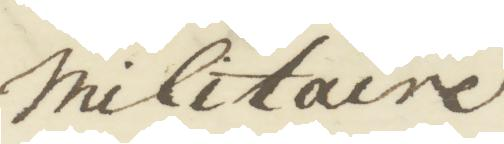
militaire
